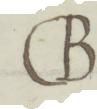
CB
